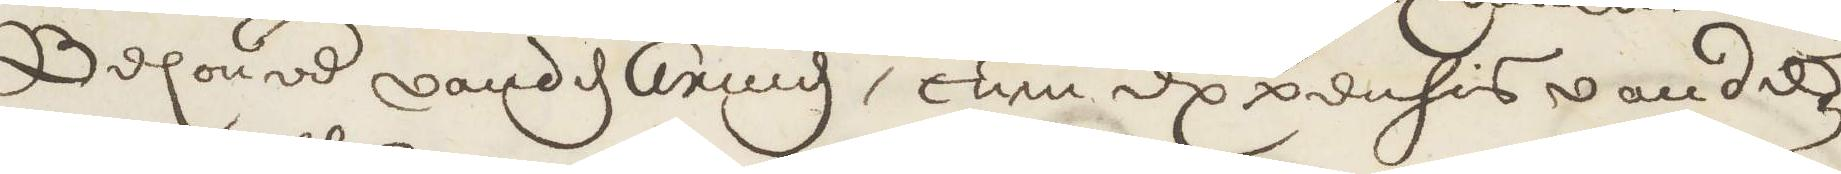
Behouve vanden armen, cum expensis van den
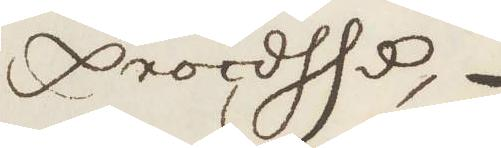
processe,
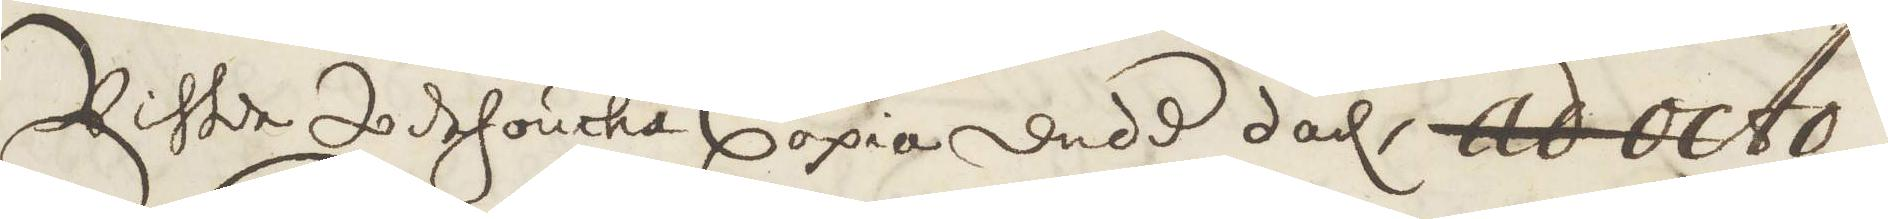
Visser versouckt Copia ende dach, ad octo
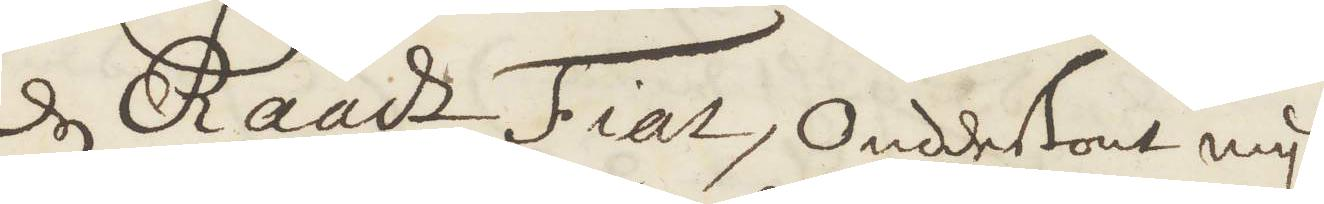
Den Raadt Fiat, Onderstont mij
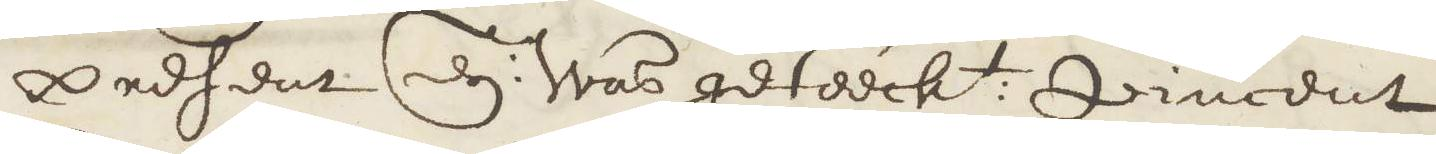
present ende was geteeck:t vincent
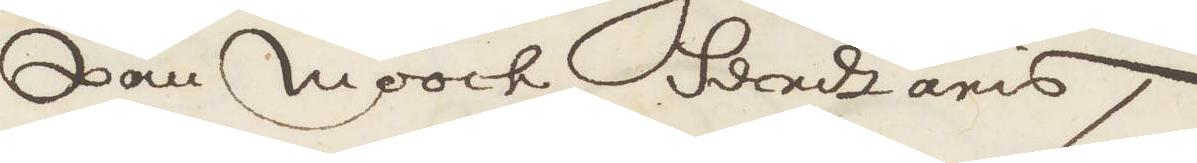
van moock Secretaris,
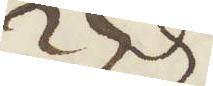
27en
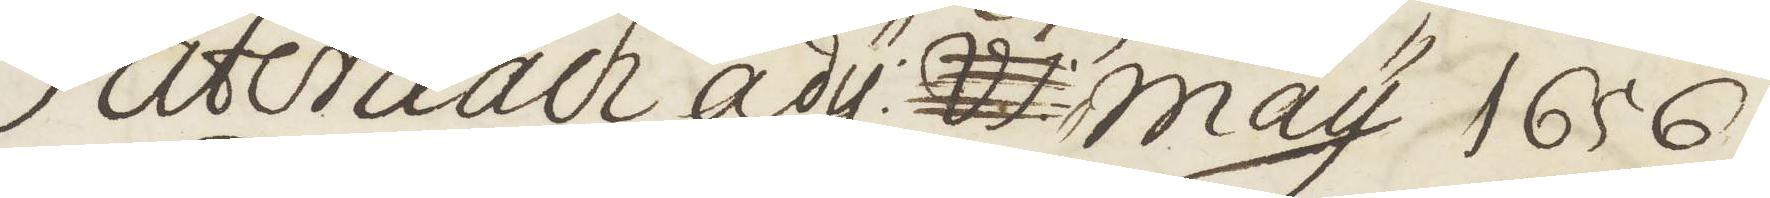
Saterdach adij: VI maij 1656
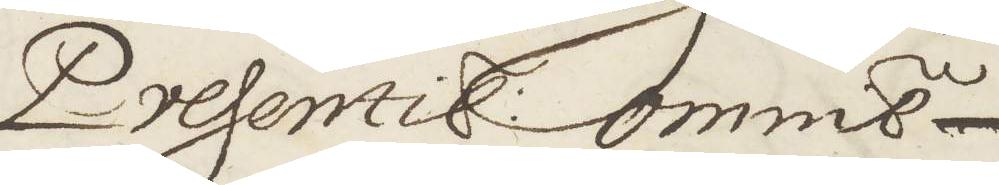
Presentib: omnib
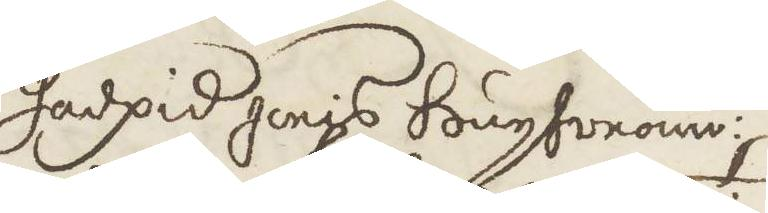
Hoff:m Jaepie Jonis Huysvrouw:
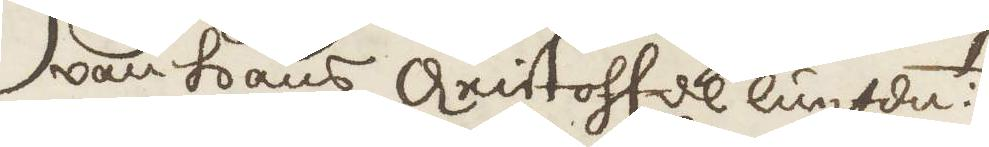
van hans Christoffel luyten:t
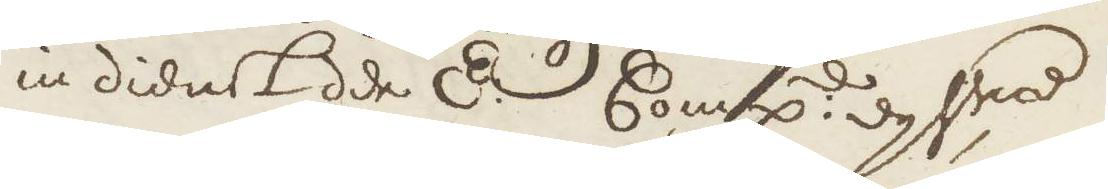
in dienst der E: Comp:e eyssrse
